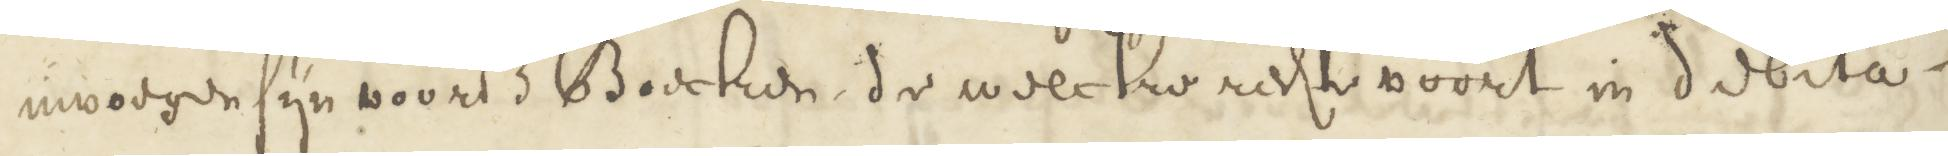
invoegen sijn voors Boecken, de welcke rechte voort in debita —
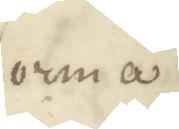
forma
